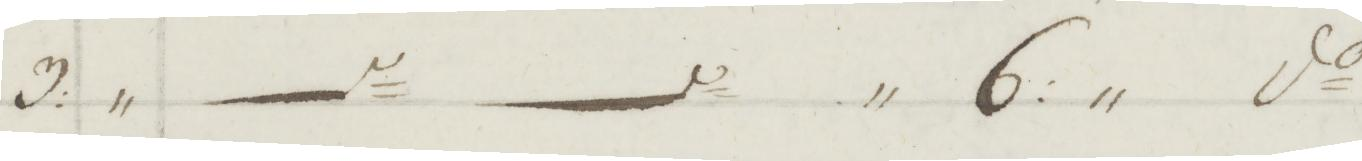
3: „ _=o _=o „ 6: „ d=o
